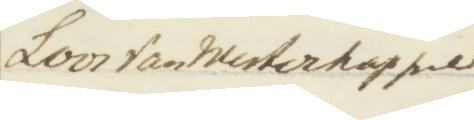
Loos van Westerkappel
